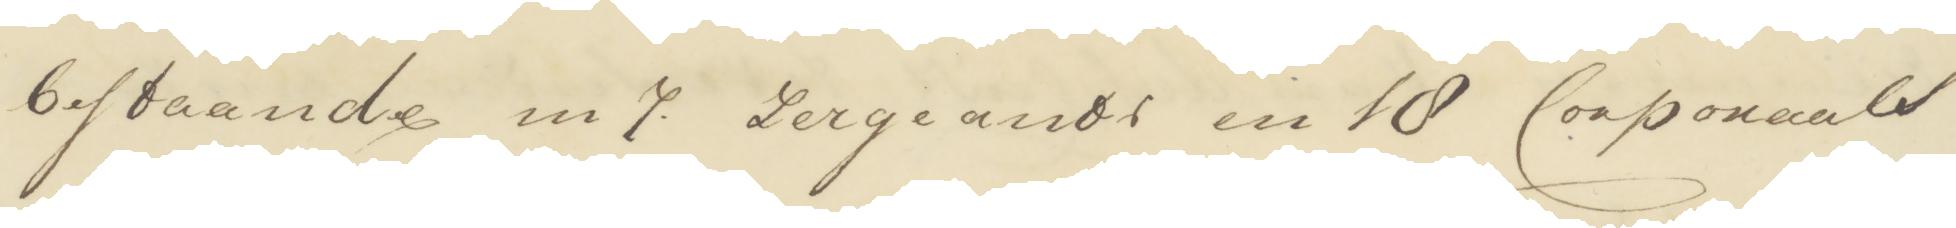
bestaande in 7. zergeants en 18 Corporaals
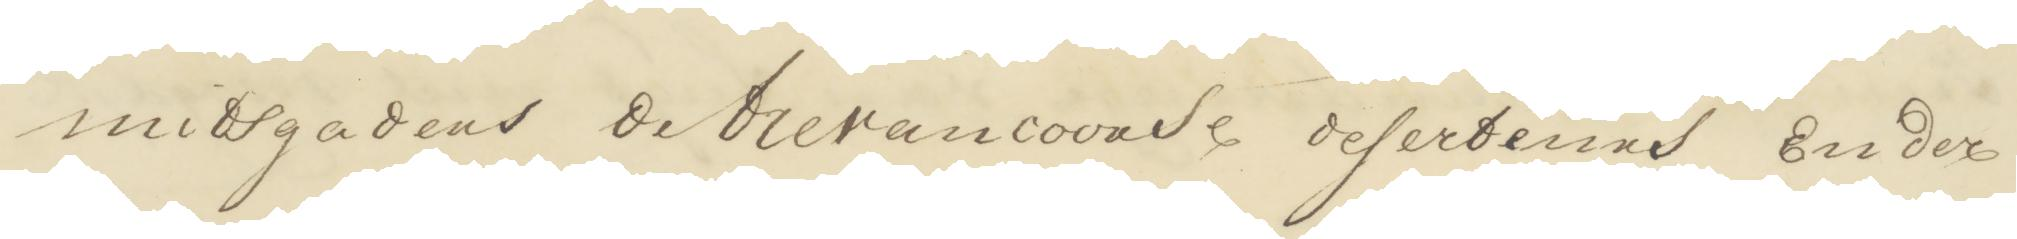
midsgaders de trevancoorse deserteurs en der
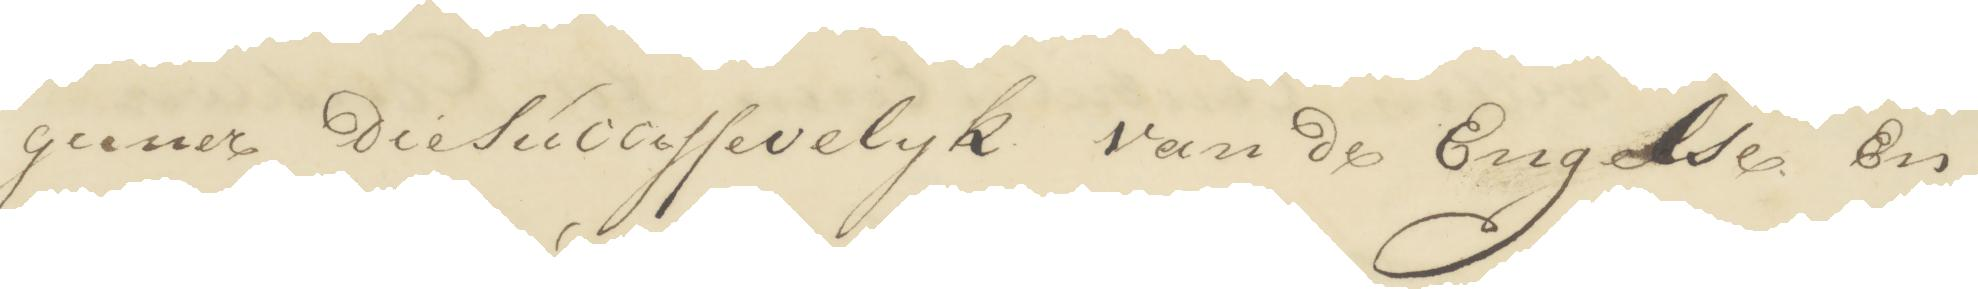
geener diesuccissevelyk van de Engelse En
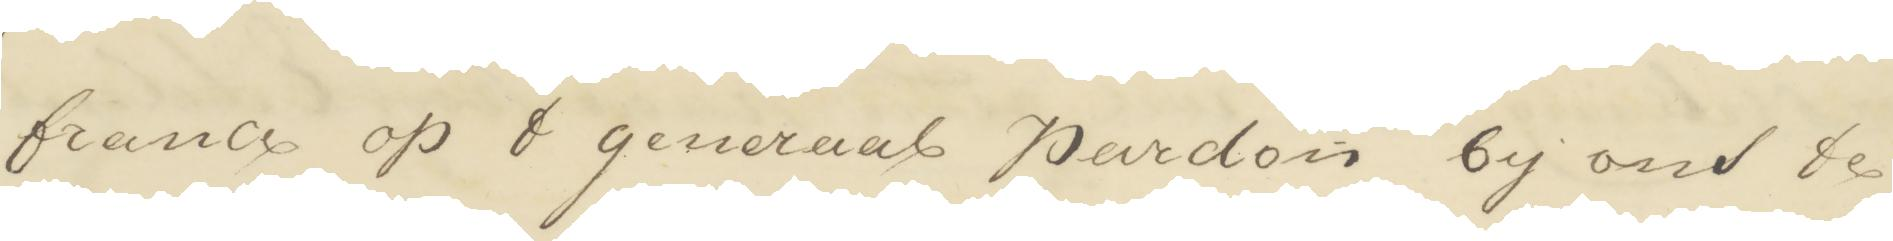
france op 't generaal pardon by ons te
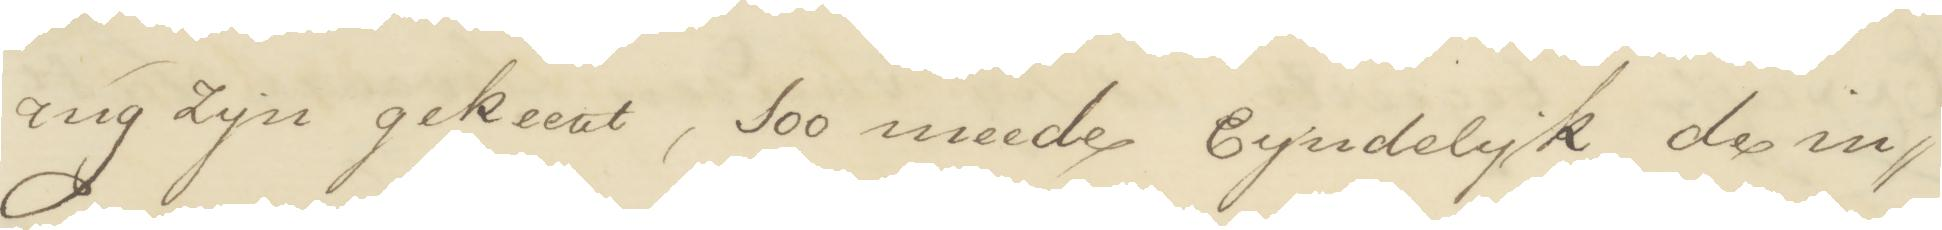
rug zyn gekeert, soo meede Eyndelyk de in„
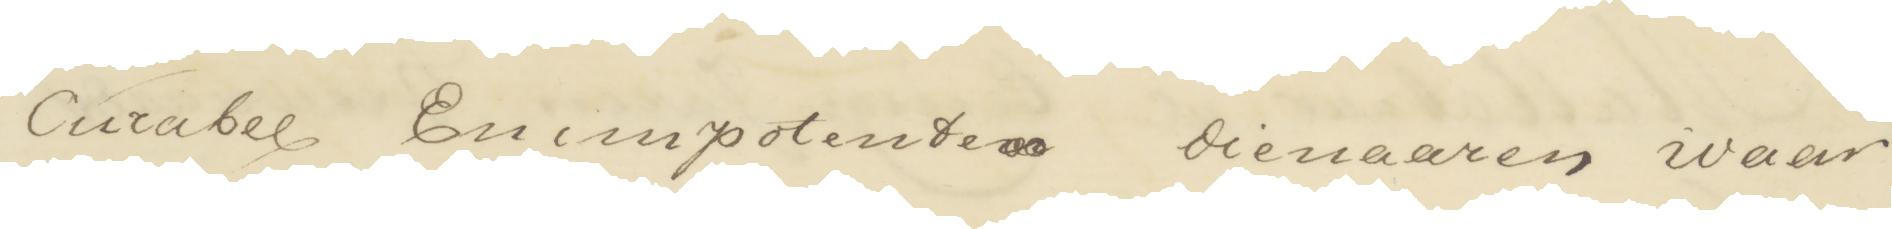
curabel En impotenten dienaaren waar
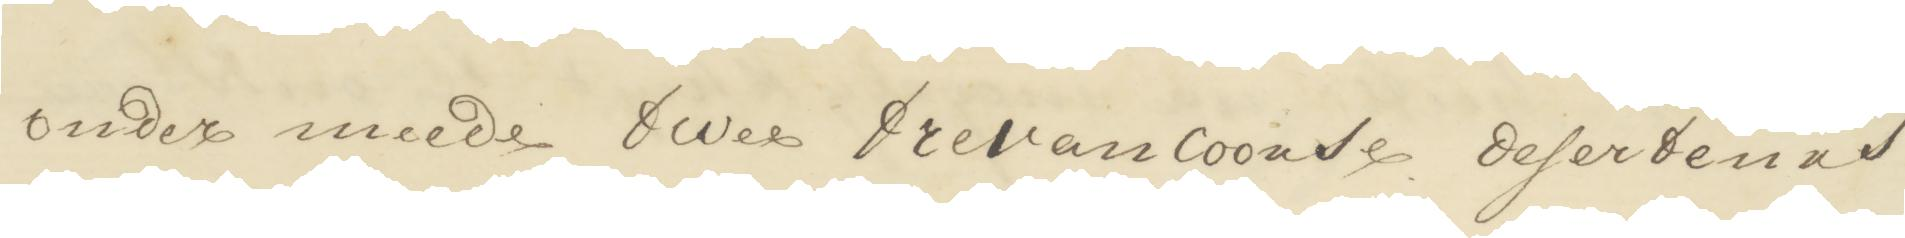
onder meede twee trevancoorse deserteurs
